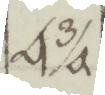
4¾
